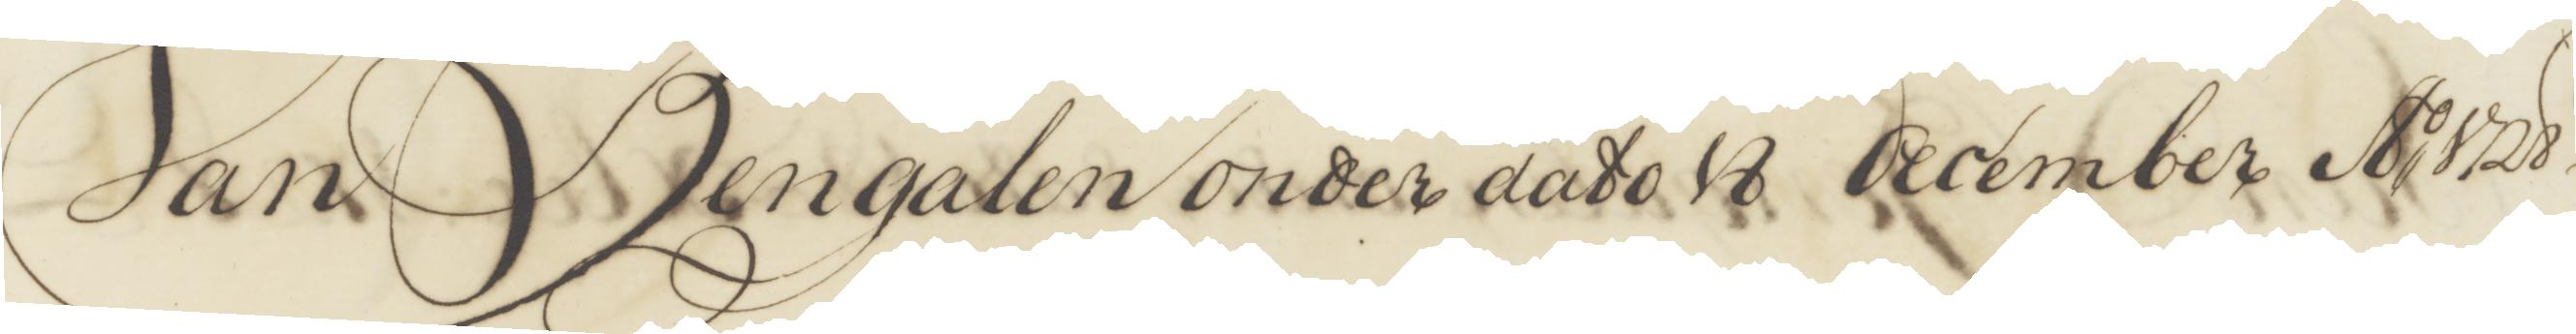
Van Bengalen onder dato 18 December A„o 1728
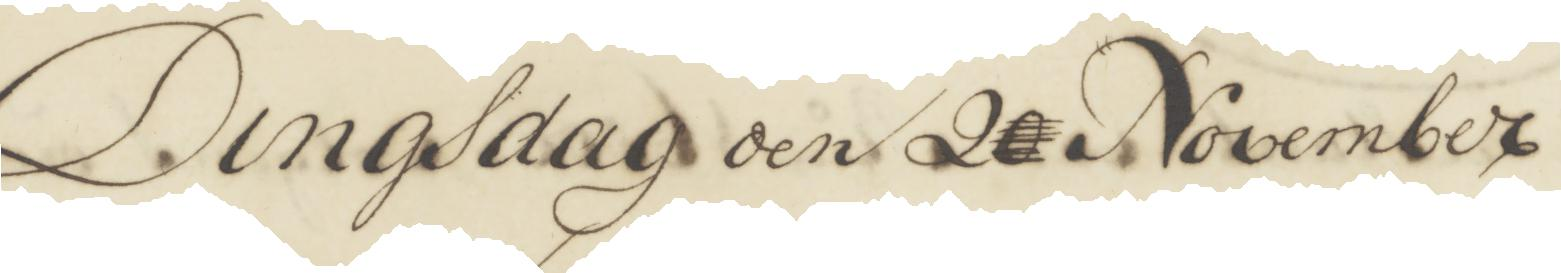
Dingsdag den 20 November
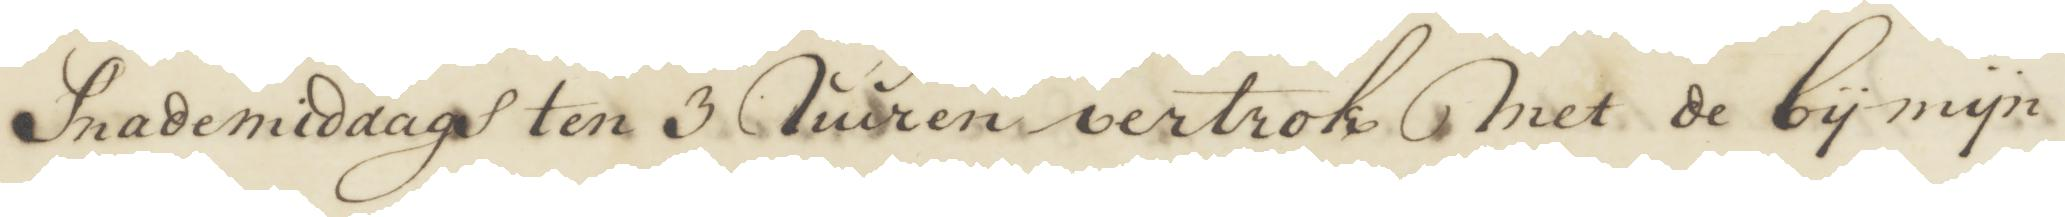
Snademiddags ten 3 duiren vertrok met de bij mijn
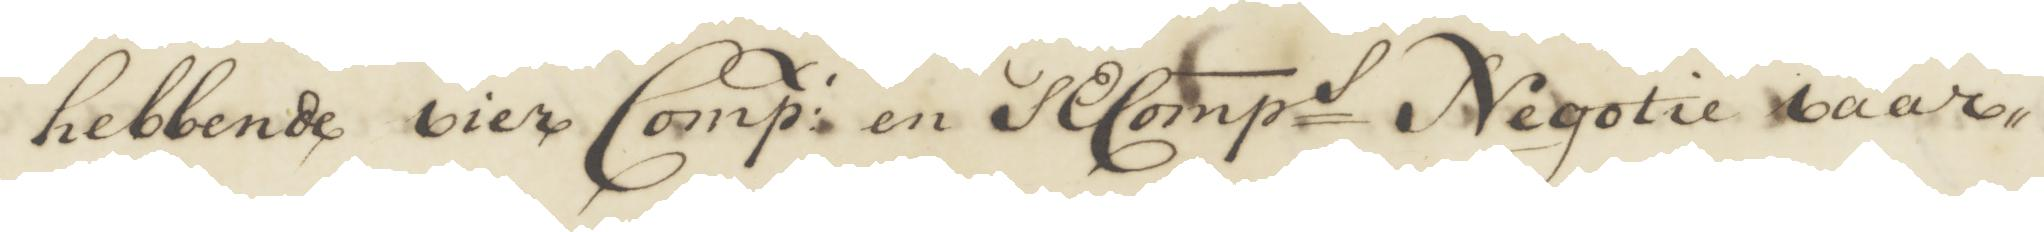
hebbende vier Comp: en ’s EComp=s Negotie vaar„
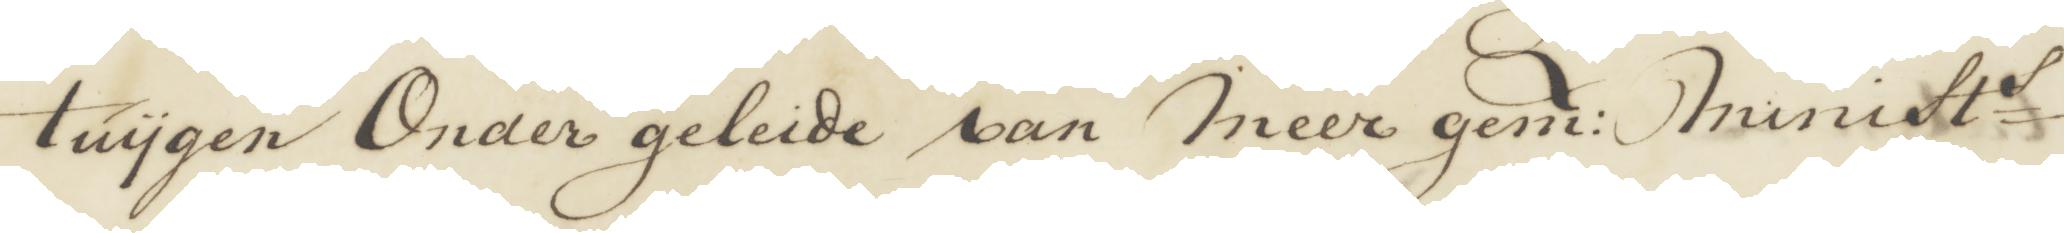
tuijgen Onder geleide van meer gem: minist=s
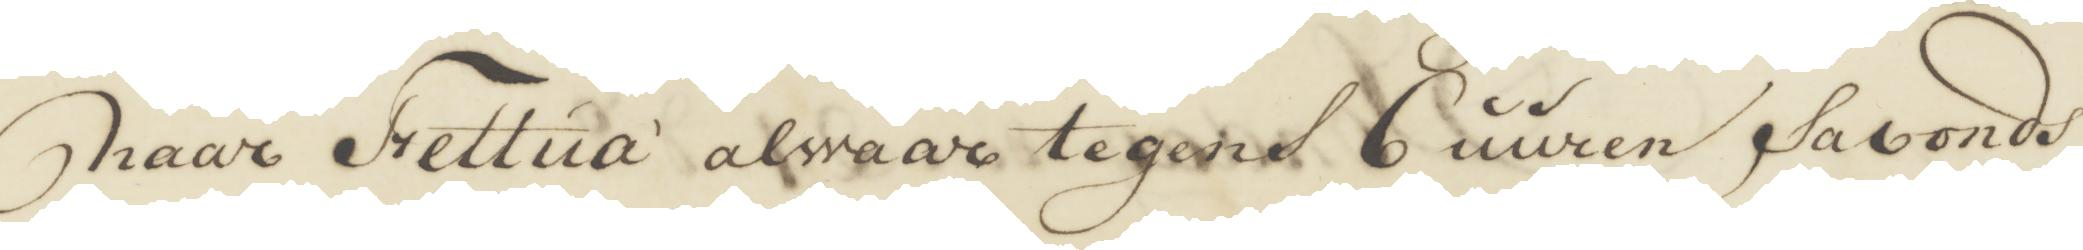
naar Fettua alwaar tegens 6 uuren savonds
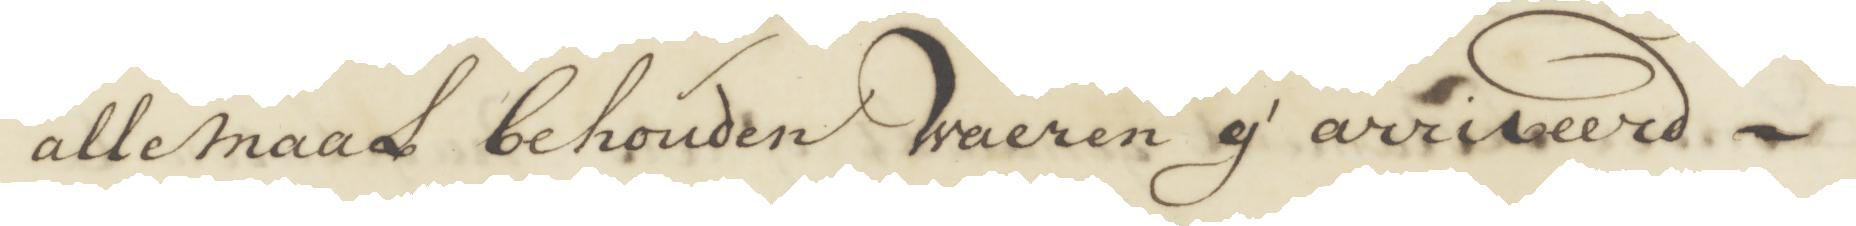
alle maal behouden waeren g’ arriveerd —
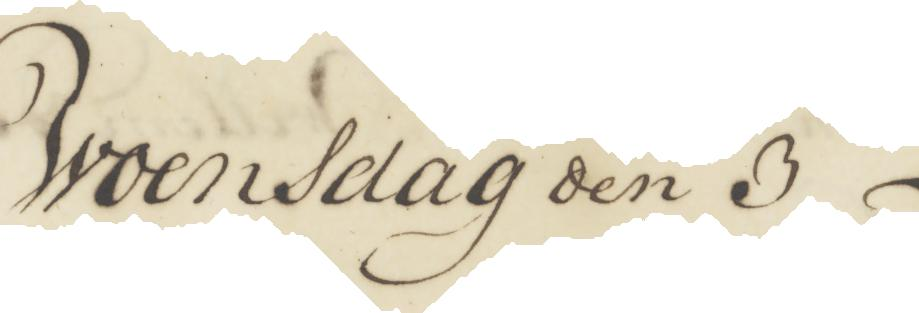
Woensdag den 3 Do
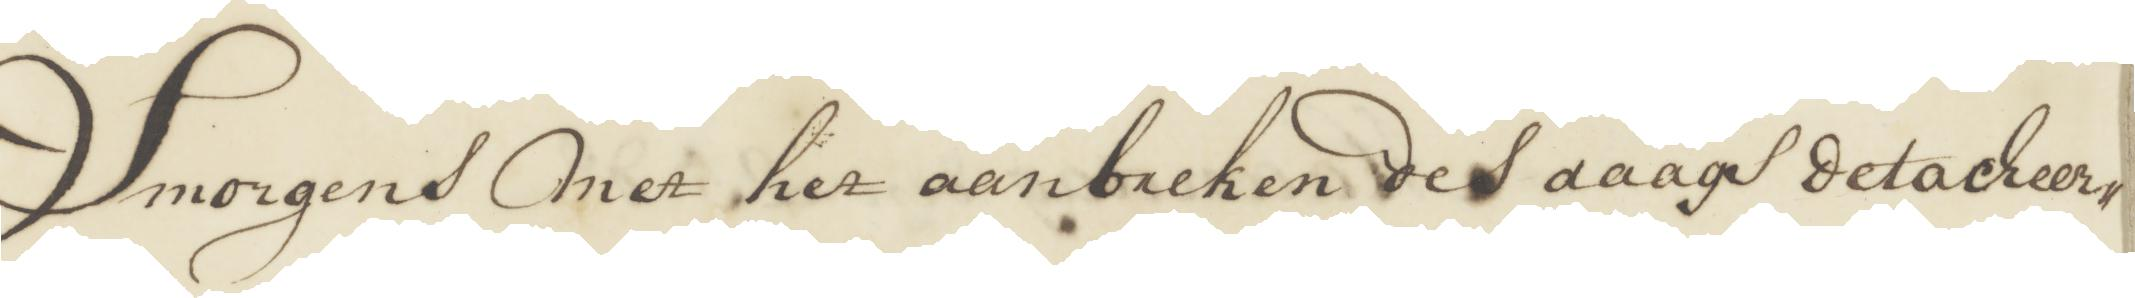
Smorgens met het aanbreken des daags detacheer„
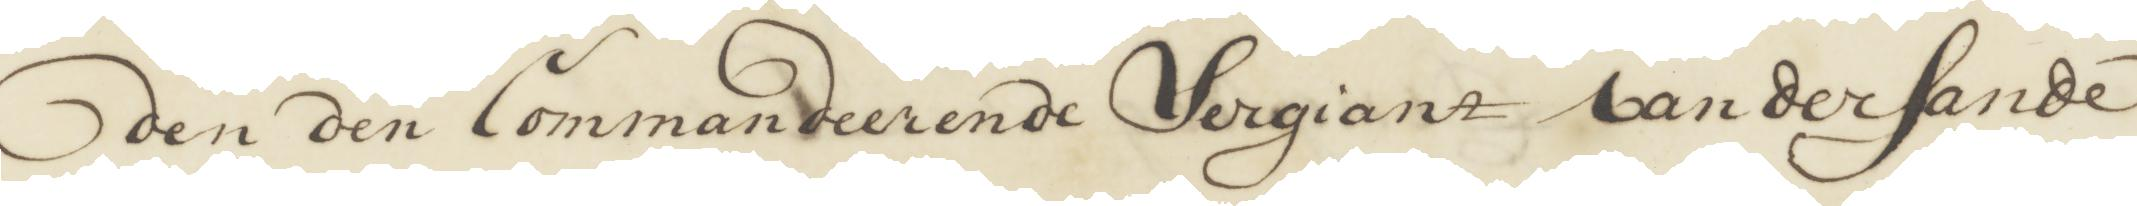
den den Commandeerende Sergiant van der sande
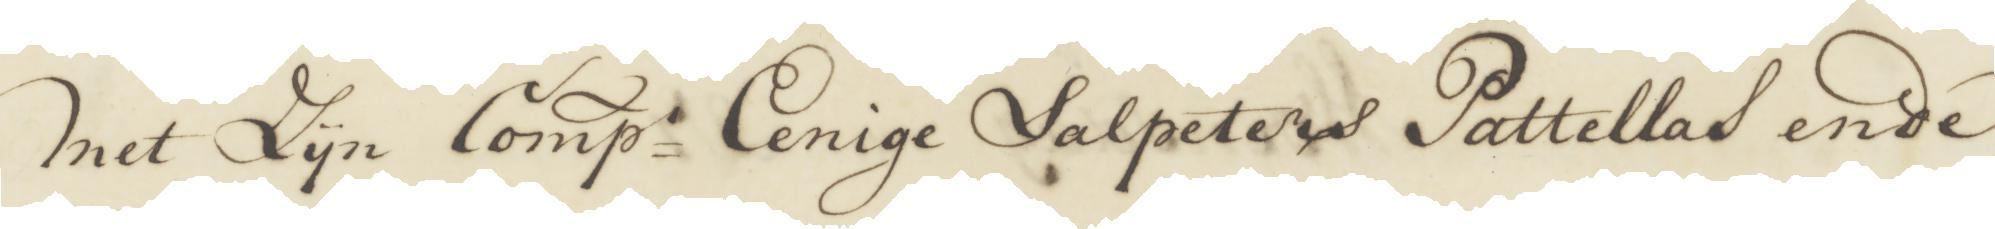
met zijn Comp=e Eenige salpeters Pattellas ende
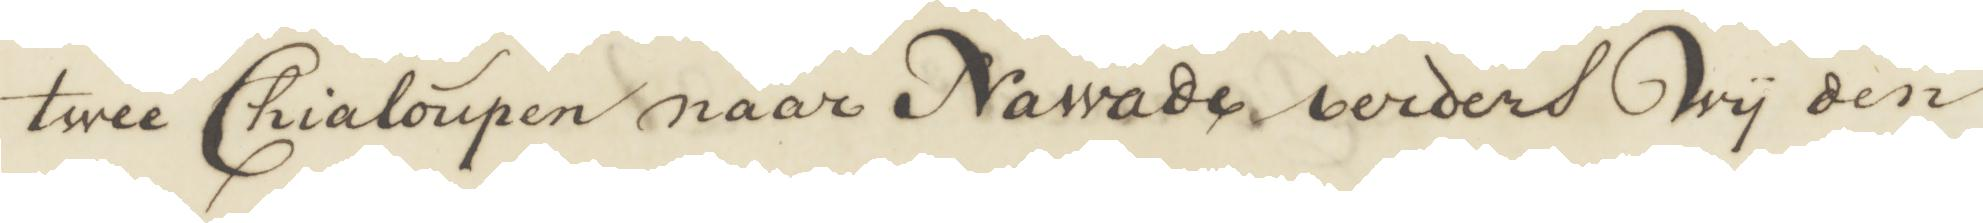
twee Chialoupen naar Nawade verders Wij den
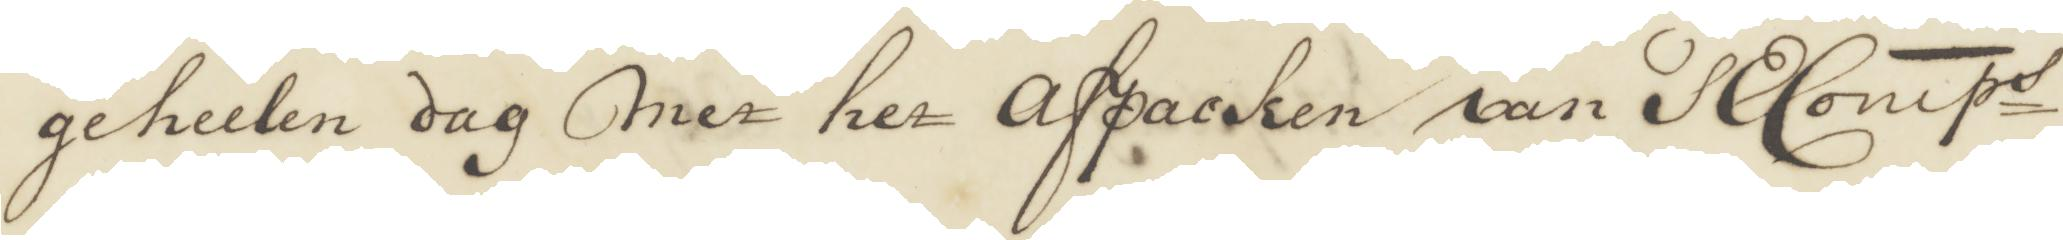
geheelen dag met het afpacken van 's EComp=s
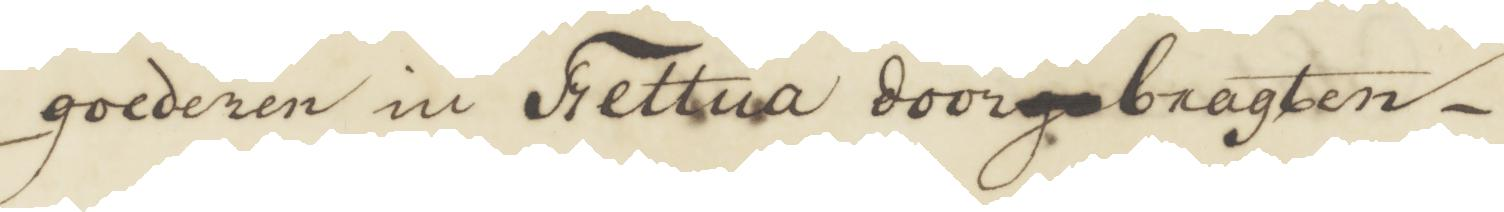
goederen in Fettua doorgebragten —
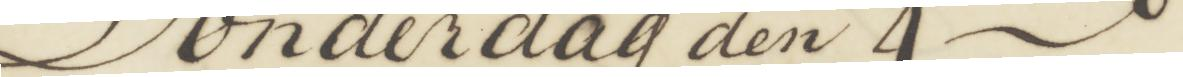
Donderdag den 4 Do
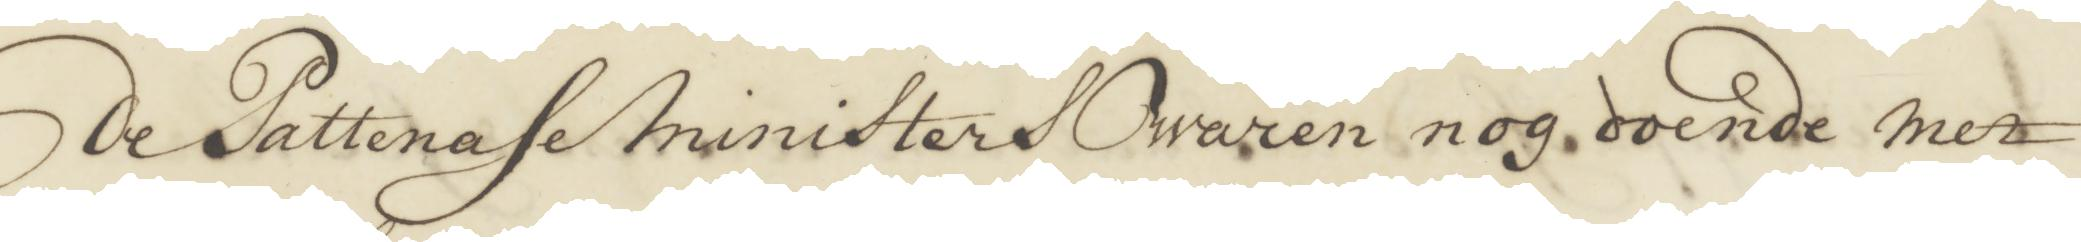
de Pattenase Ministers Waren nog doende met
